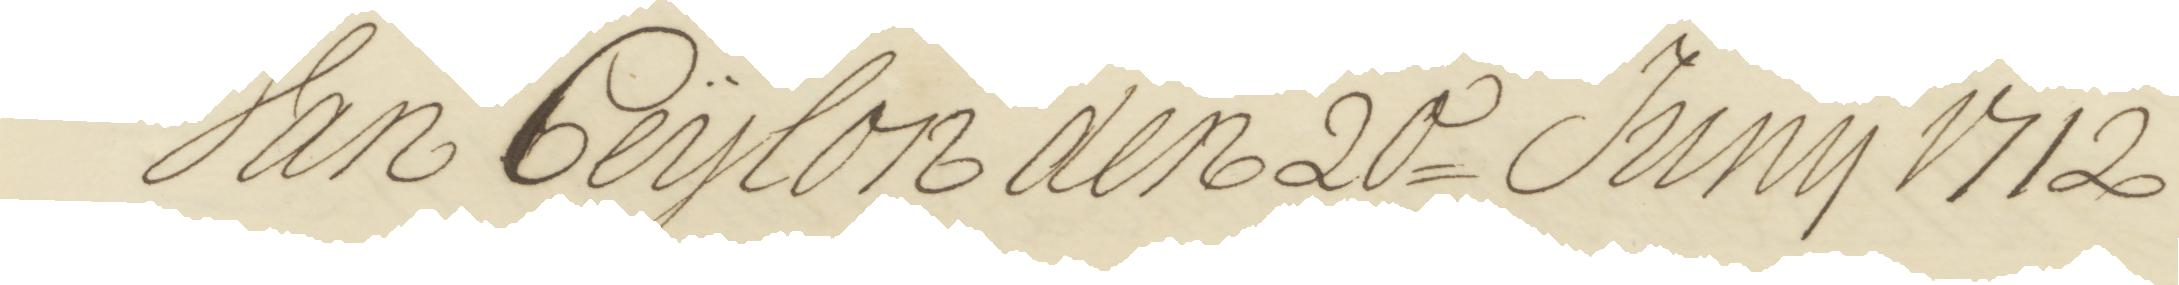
Van Ceijlon den 20= Iunij 1712
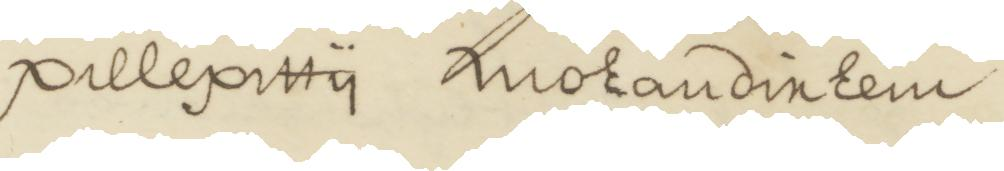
pillepittij mohandirhem
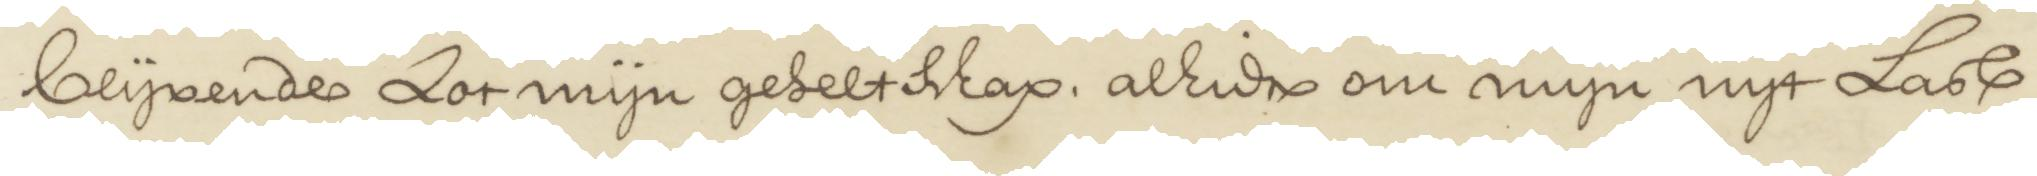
blijvende tot mijn geseltschap, alhier om mijn uijt Last
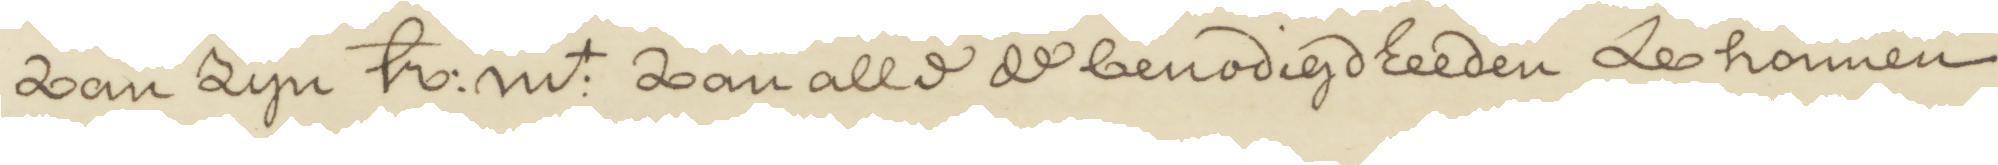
van zijn k: m:t van alle de benodigdheeden te konnen
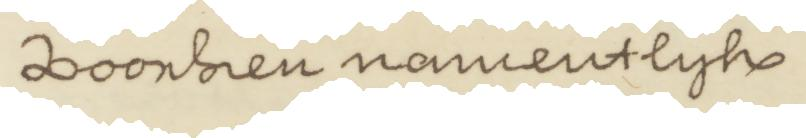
voorsien namentlijk
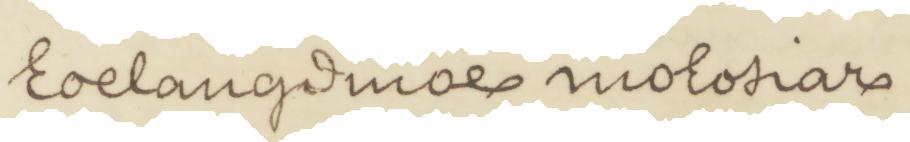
hoelangemoe mohosiar
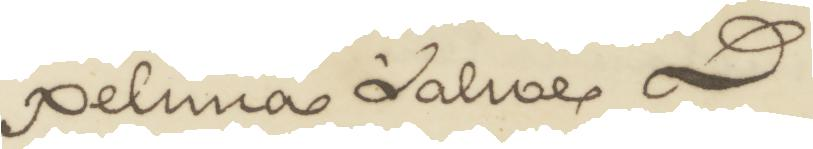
pelima zalwe E
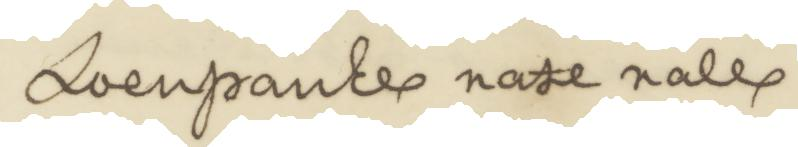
Zoenpanhe rate rale
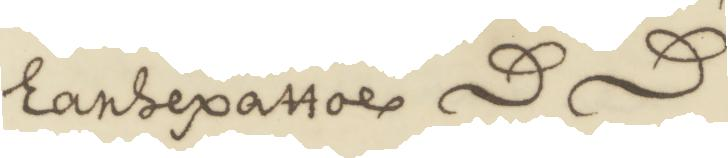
harsepattoe E E
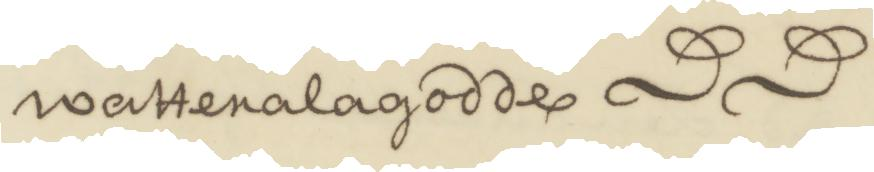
watteralagodde E E
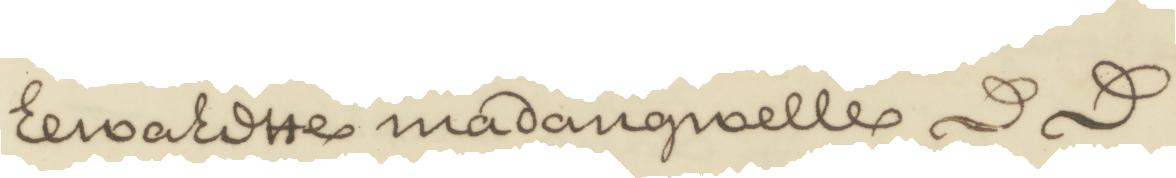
hewahette madangwelle E E
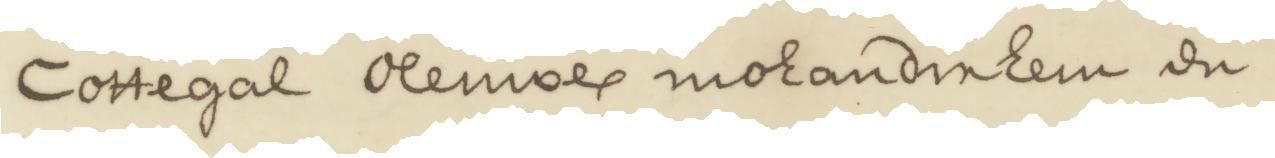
Cottegal Oleuwe mohandirhem en
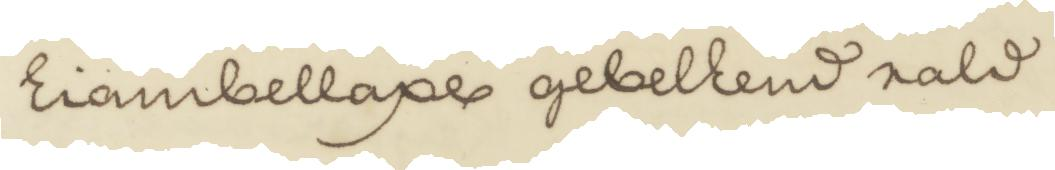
hiambellape gebelhene rale
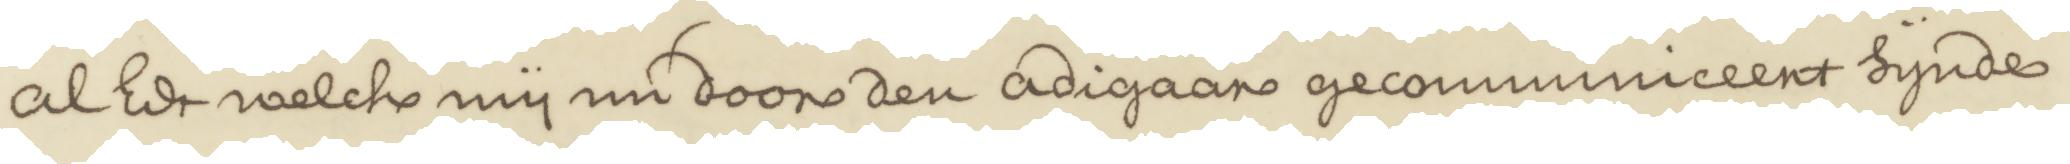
al het welck mij nu door den adigaar gecommuniceert sijnde
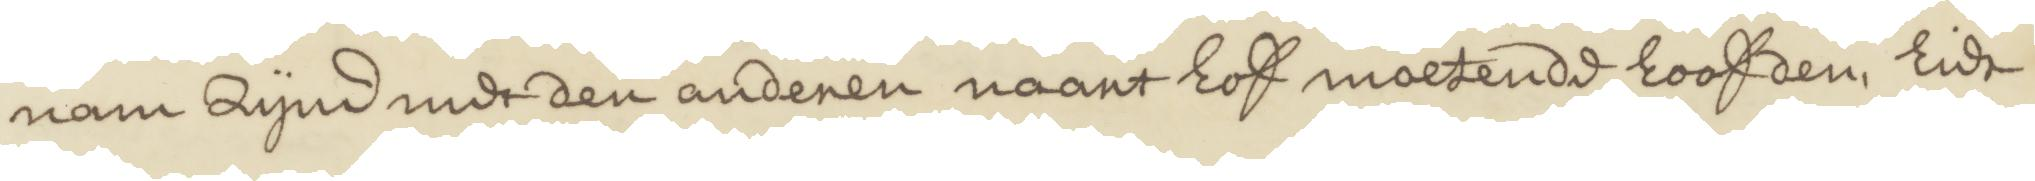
nam zijne met den anderen naart hof moetende hoofden, hier
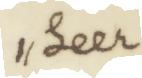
„seer
